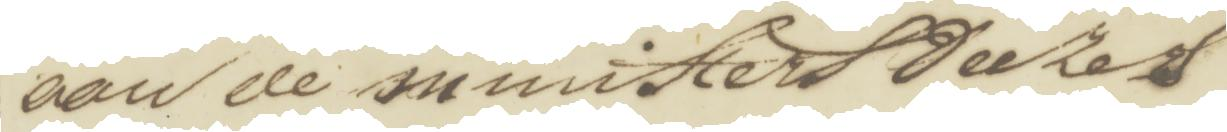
aan de ministers deezes
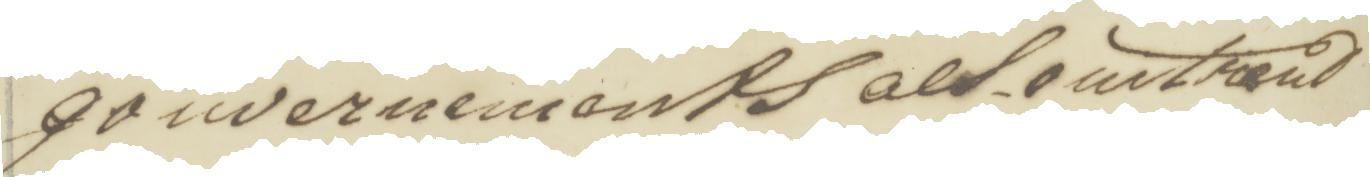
gouvernements als omtrend
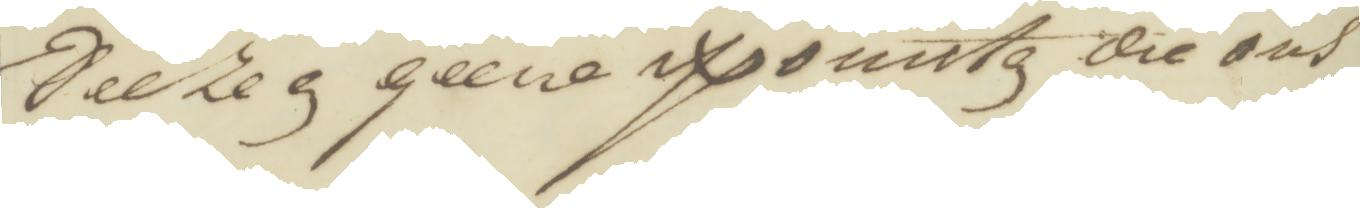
deeze en geene pointen die ons
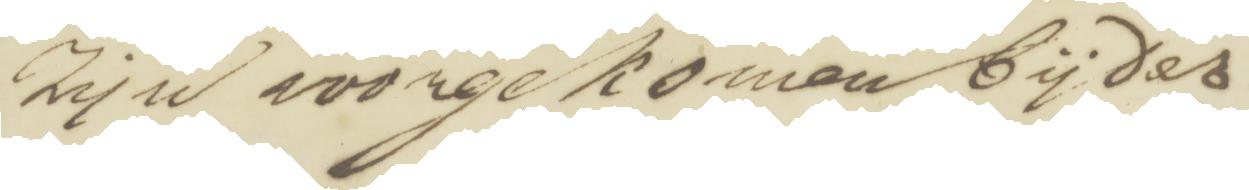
zijn voorgekomen bij der
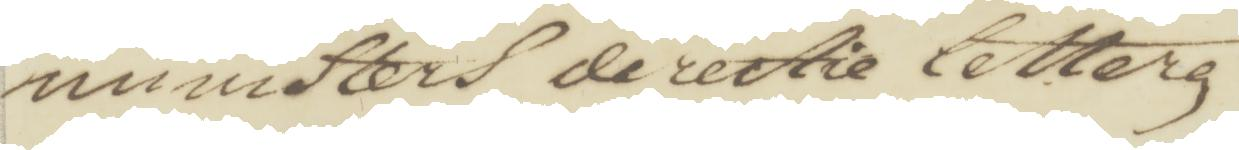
ministers directie letteren
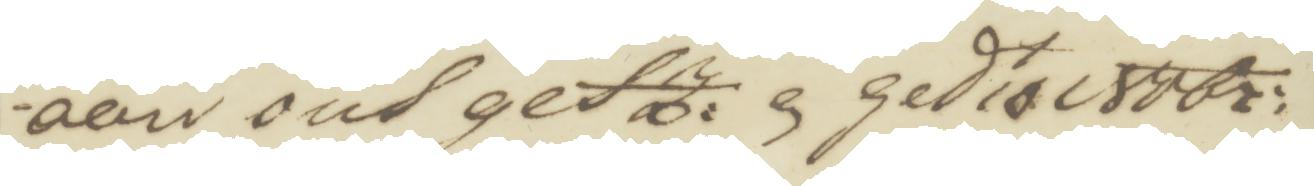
aan ons gesz: en ged:t octobr:
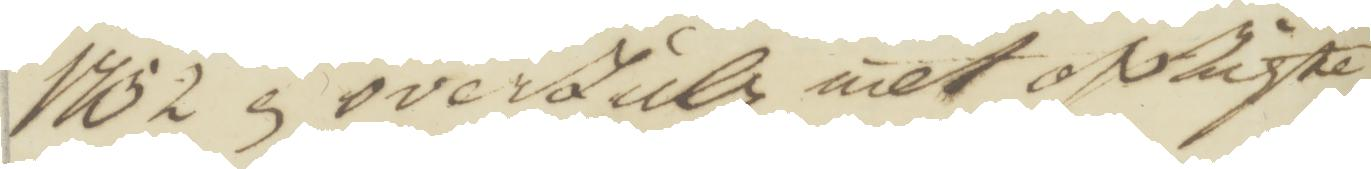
1752 en overzulx niet opzigte
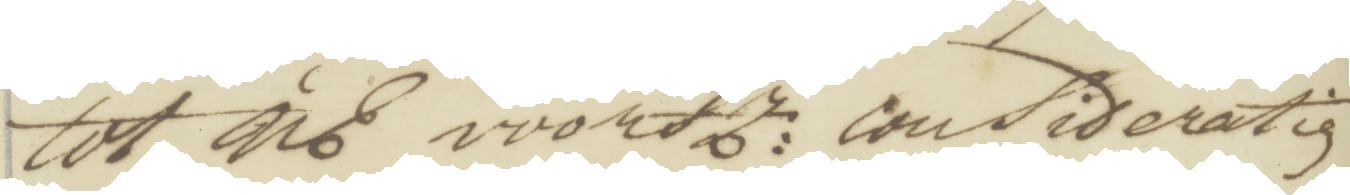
tot uE voorsz: consideratien
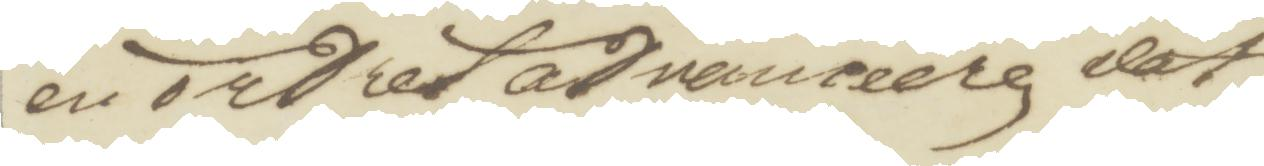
en ordres advanceeren dat
